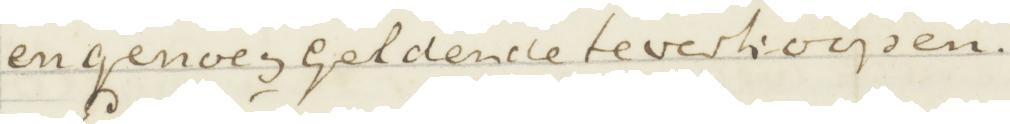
en genoeg geldende te verkoopen.
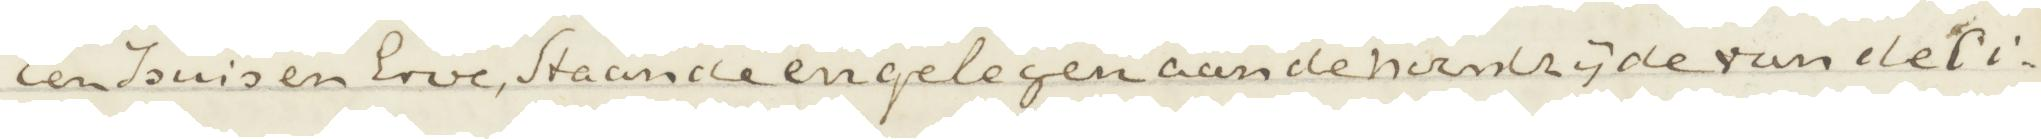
Een huisen Erve, Staande en gelegen aan de noordzijde van de Ci„
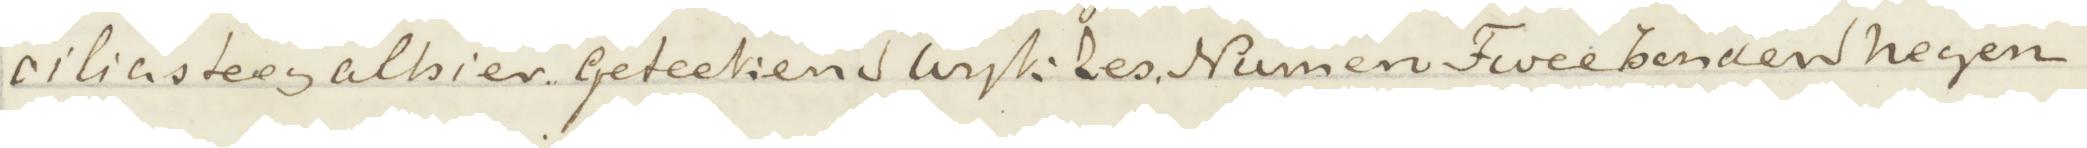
ciliasteeg alhier geteekend wyk Zes Numero Twee honderd Negen
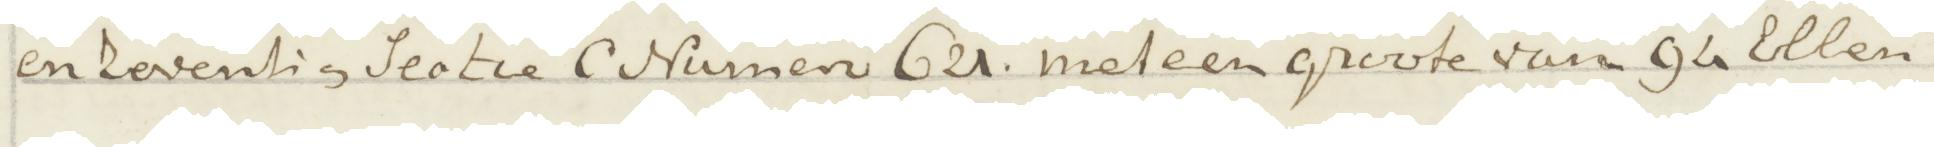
en Zeventig Sectie C Numero 621. met een groote van 94 Ellen
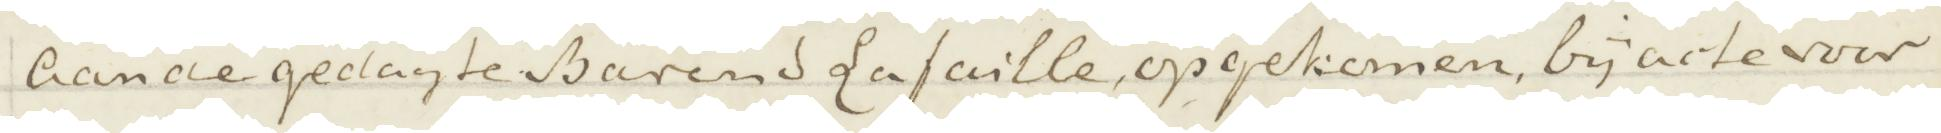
Aan de gedagte Barend Lafaille, opgekomen, bij acte voor
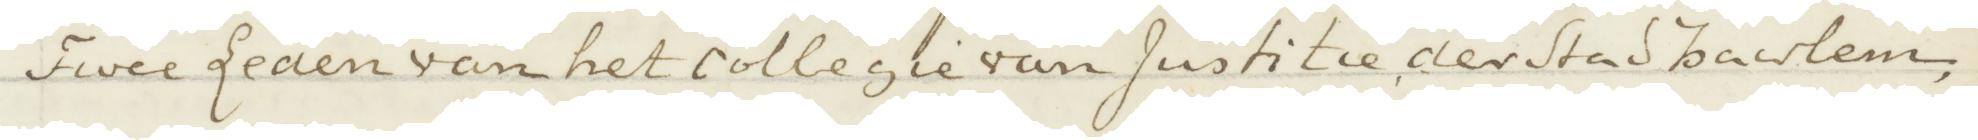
Twee Leden van het collegie van Justitie der Stad haarlem,
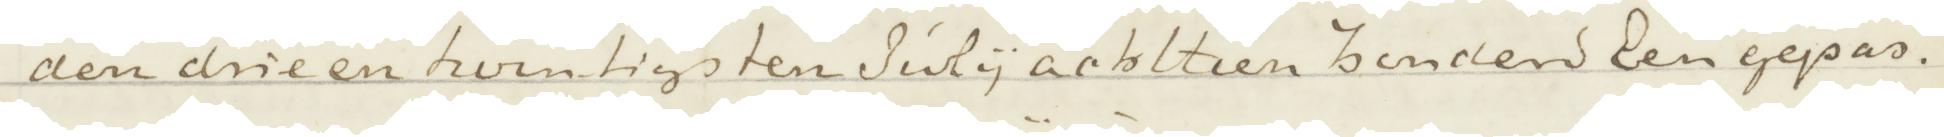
den drie en twintigsten Iulij achttien honderd Een gepas.
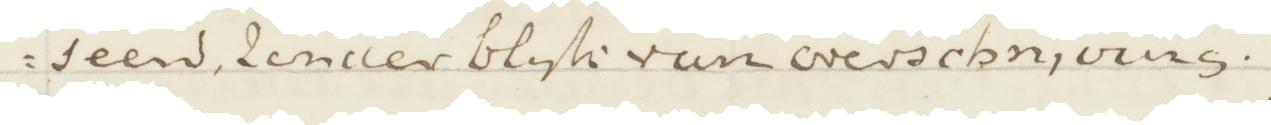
=seerd, Zonder blyk van overschrijving.
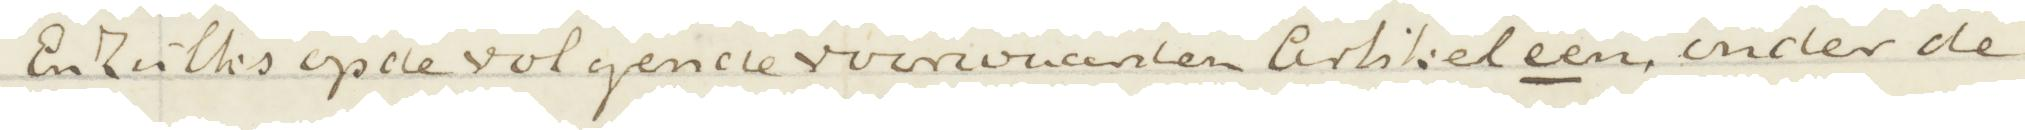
en Zulks op de volgende voorwaarden Artikel een, onder de
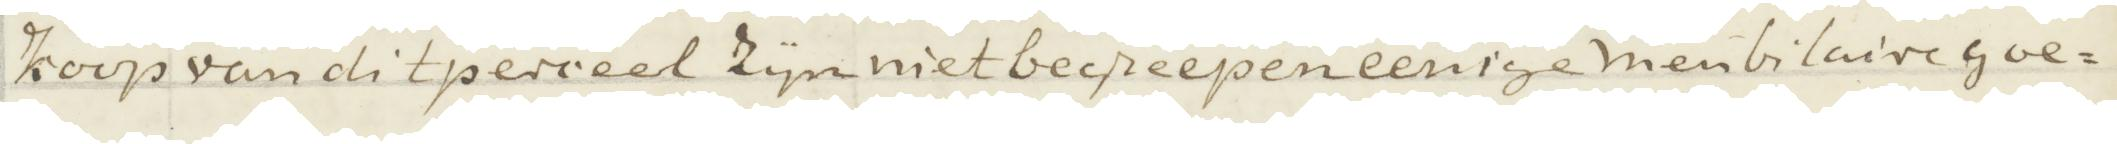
koop van dit perceel Zijn niet begreepen eenige meubilaire goe=
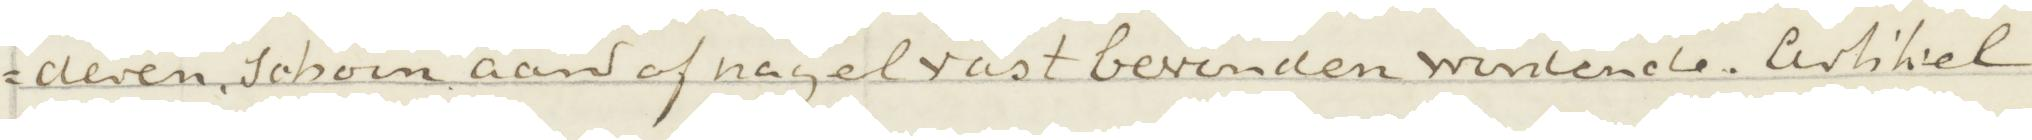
=deren, schoon aard of nagelvast bevonden wordende. Artikel
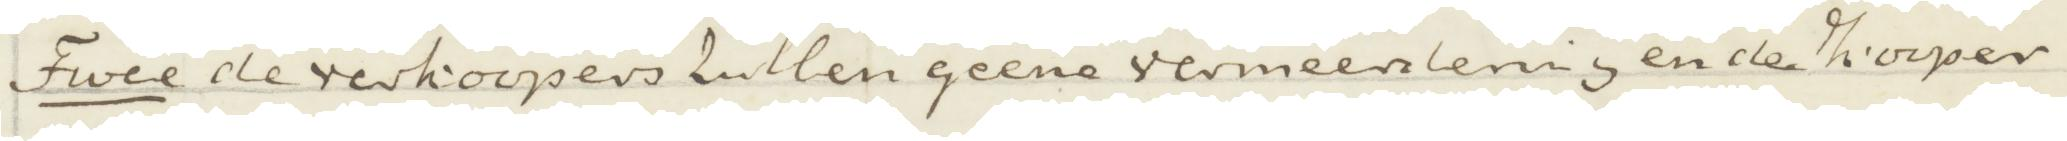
Twee de verkoopers Zullen geene vermeerdering en de kooper
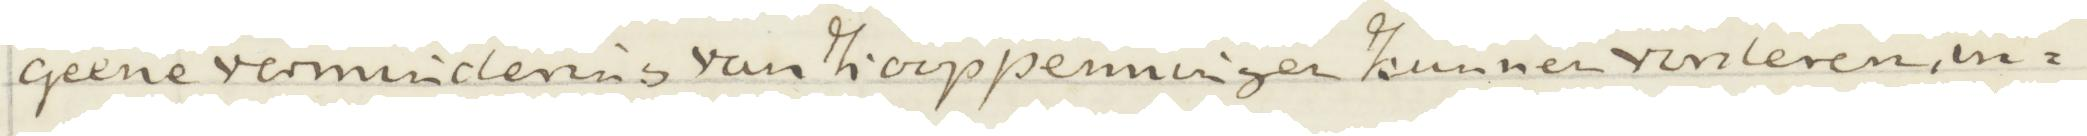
geene vermindering van kooppenningen kunnen vorderen, in=
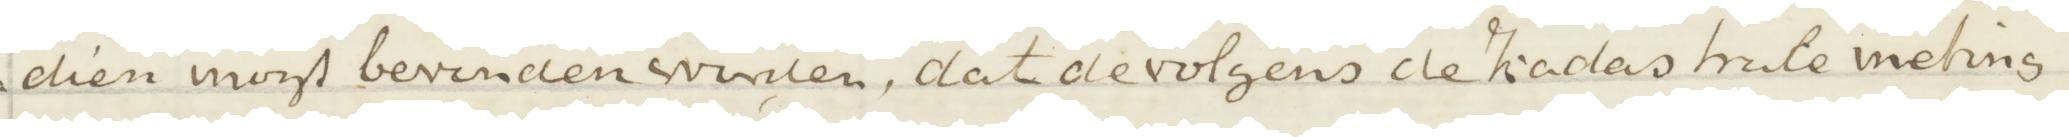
„dien mogt bevonden worden, dat de volgens de kadastrale meting
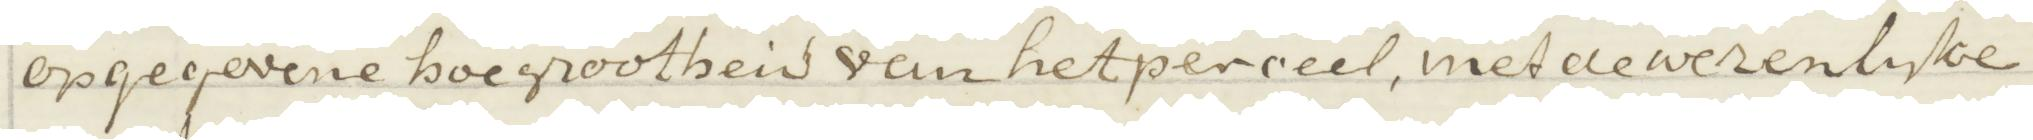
opgegevene hoegrootheid van het perceel, met de wezenlyke
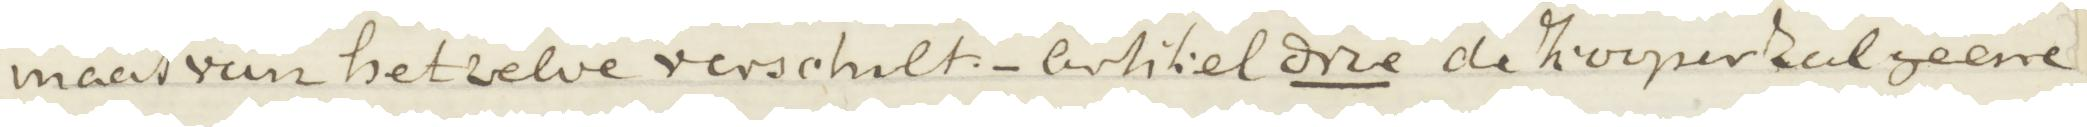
maat van het zelve verschilt - artikel drie de kooper Zal geene
